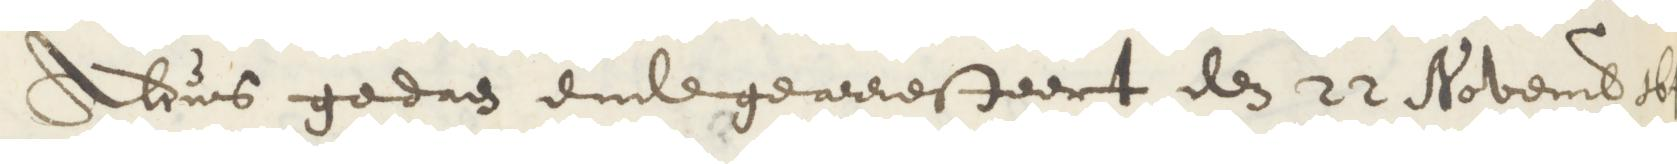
Aldus gedaen ende gearresteert den 22 Novemb 16
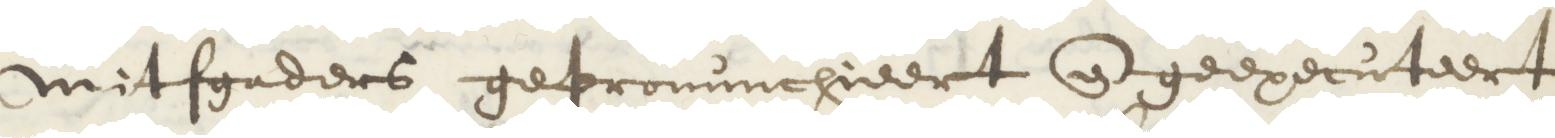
mitsgaders gepronunchieert ende geexecuteert
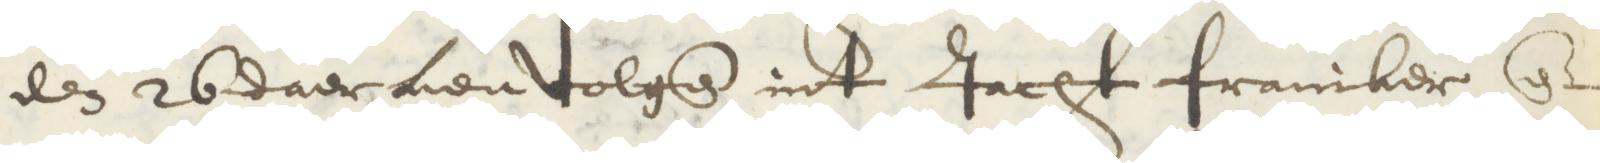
den 26 daer Aen volgende int Jacht franiker ende
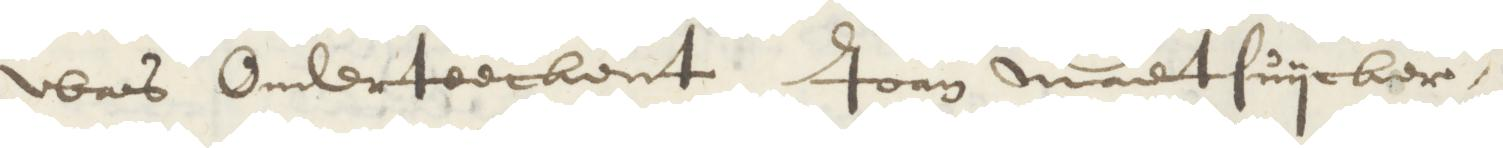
was Onderteeckent Joan maetsuijcker
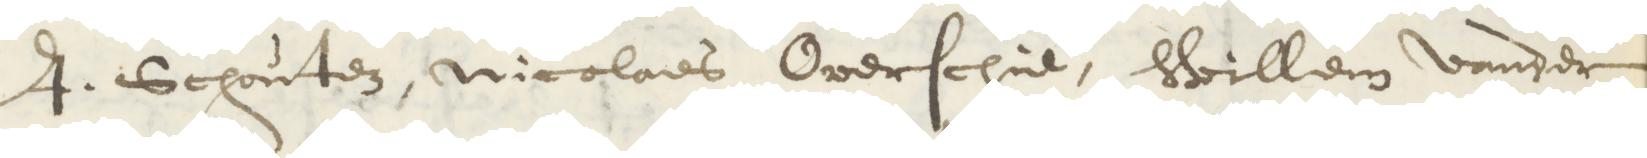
J. schouten, nicolaes Overschie, willem vander
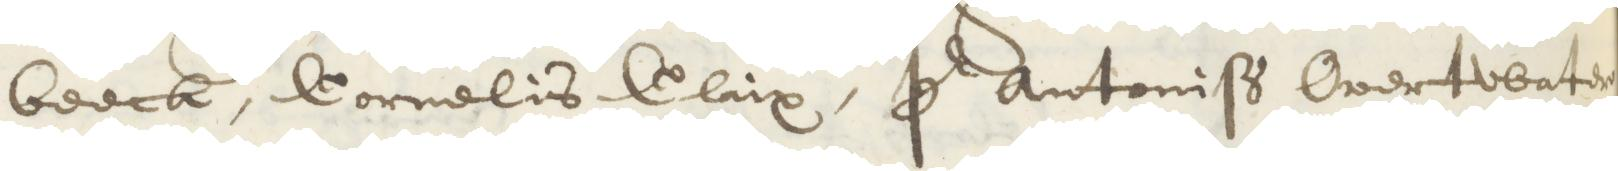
beeck, Cornelis Clix, ph antonisz Overtwater
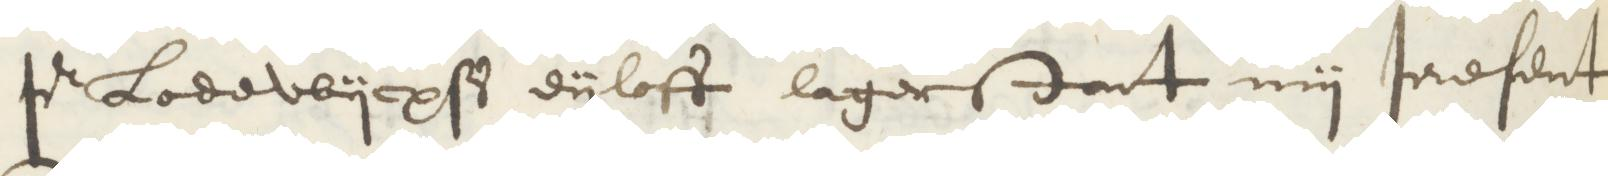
pr Lodewijcxsz eijloff lagerstont mij present
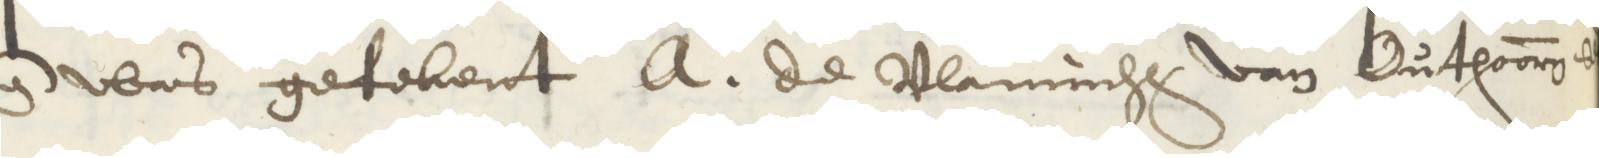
ende was getekent A. de Vlamingh van Outhoorn
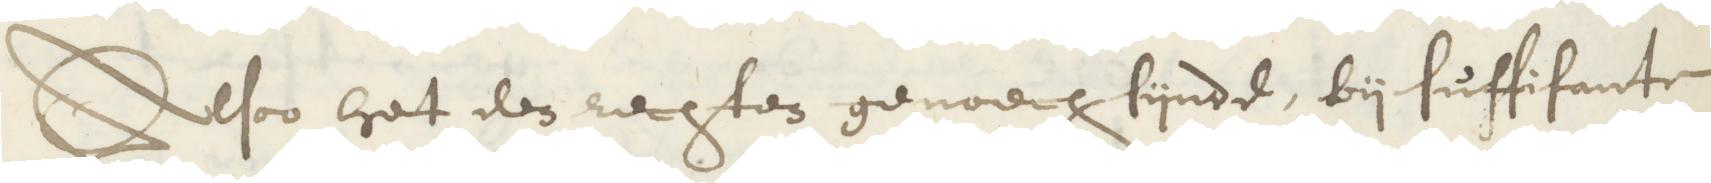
Alsoo het den regten genoech sijnde, bij suffisante
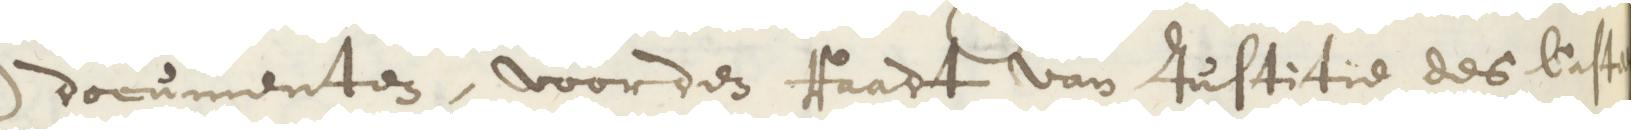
documenten, voor den Raadt van Justitie des bast
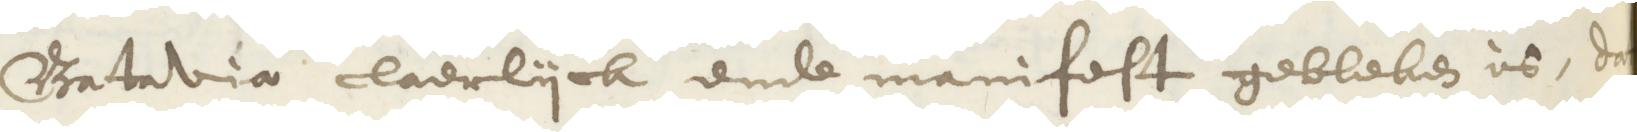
Batavia claerlijck ende manifest gebleken is, da
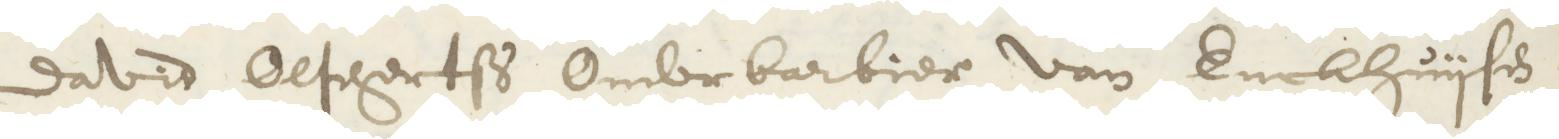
David Olphertsz Onderbarbier van Enckhuijsen
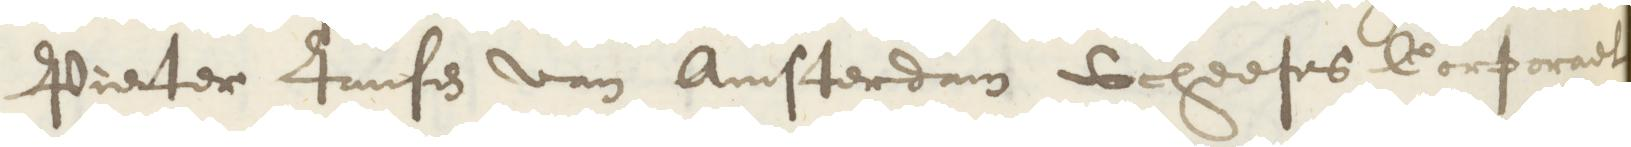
Pieter Jansen van Amsterdam Scheeps Corporael
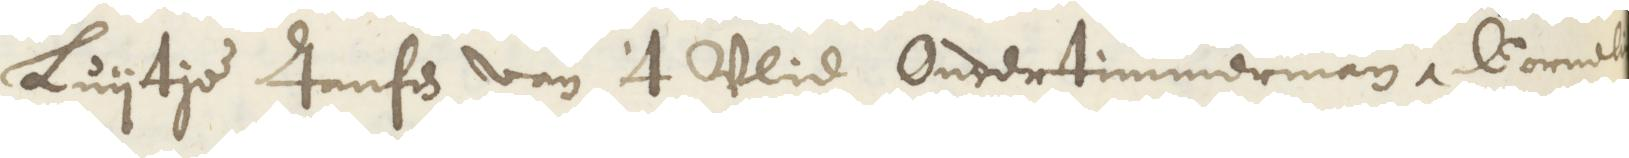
Luijtje Jansen van ’t Vlie Ondertimmerman ^ Cornel
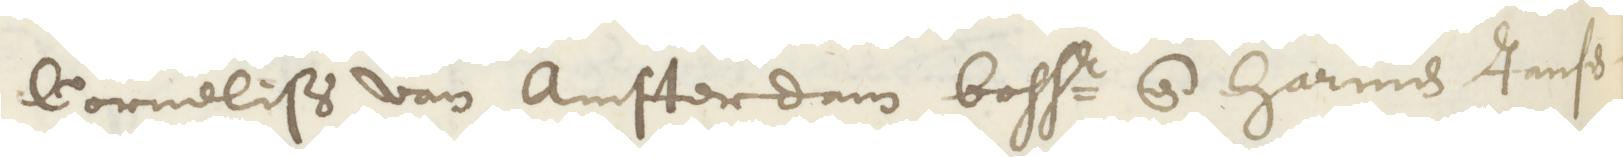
Cornelisz van Amsterdam boss=r ende harmen Jansen
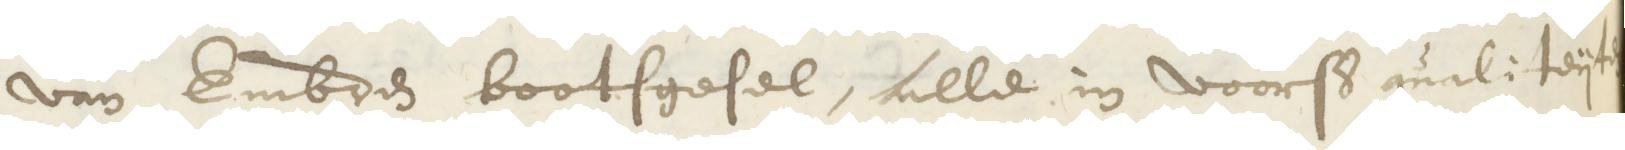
van Embden bootsgesel, Alle in voorsz qualiteijten
